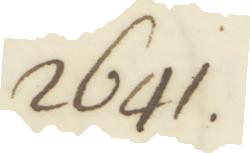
2641.
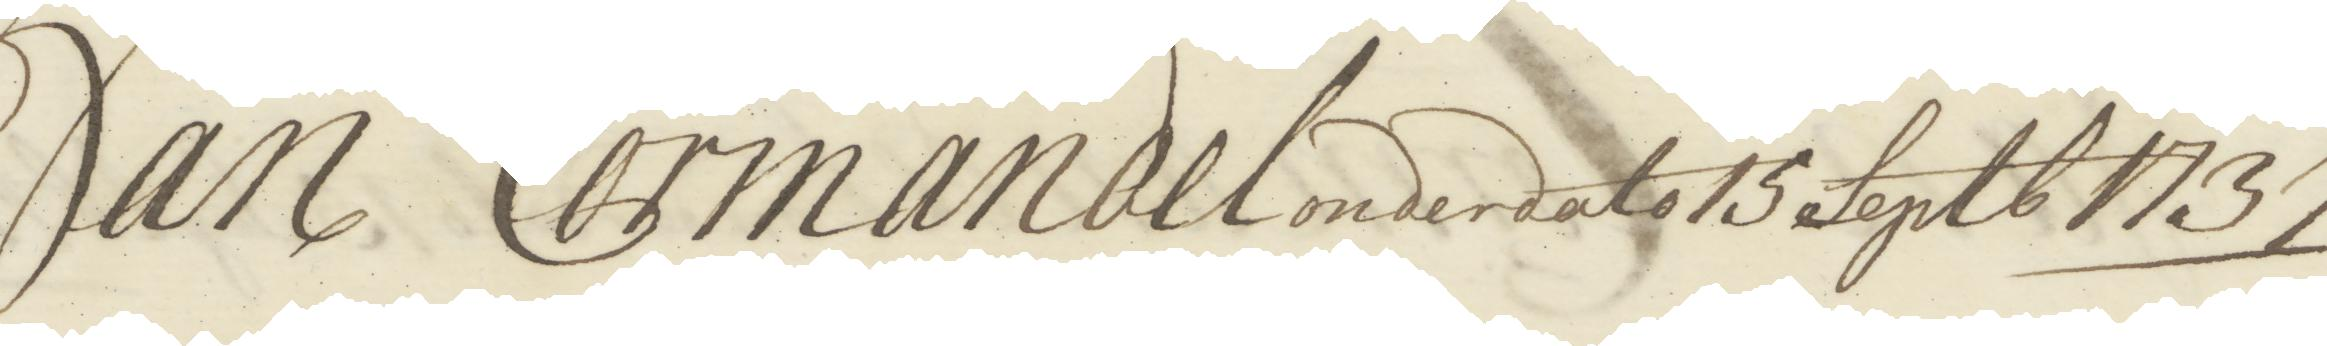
Van Cormandel onder dato 15 Septb 1737
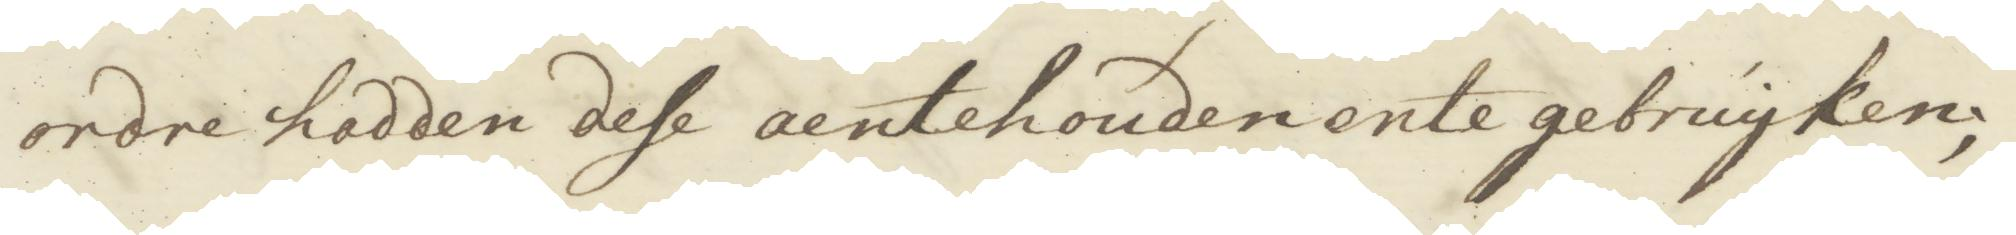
ordre hadden dese aentehouden en te gebruijken;
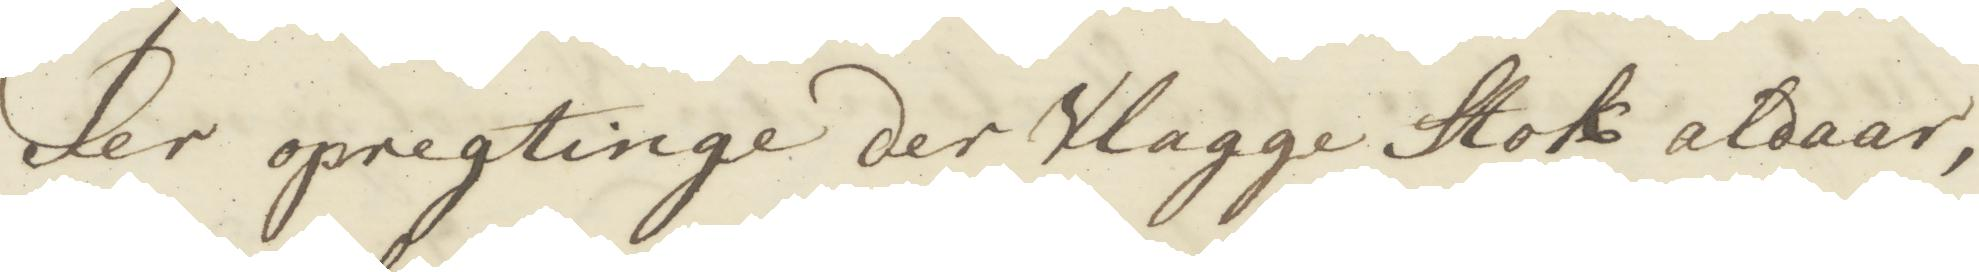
Ter opregtinge der vlagge stok aldaar,
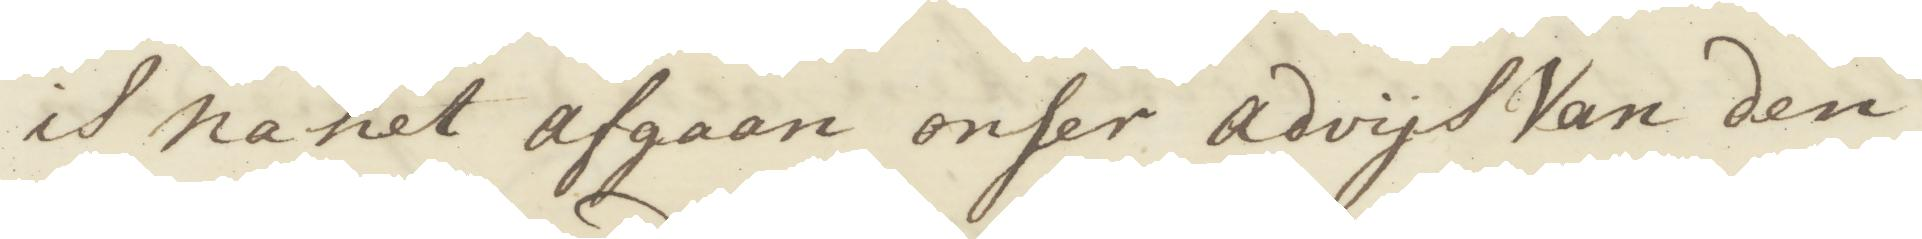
is na het afgaan onser advijs van den
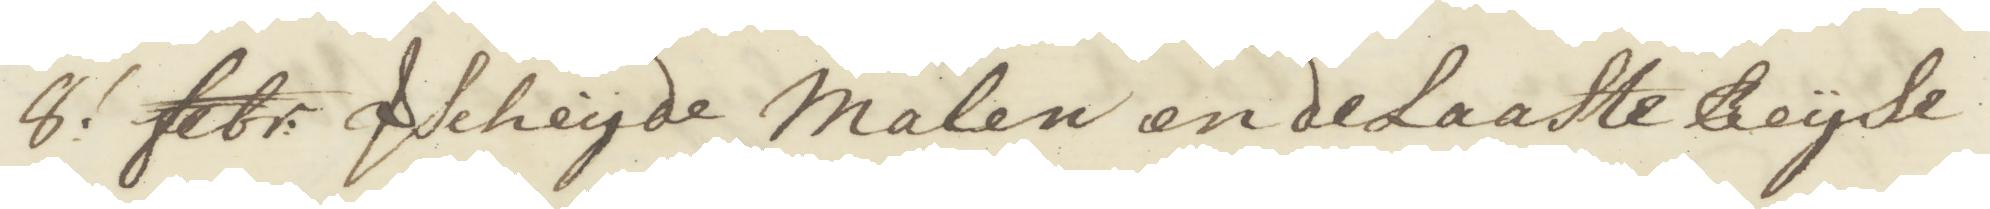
8: febr: verscheijde malen en de laaste Reijse
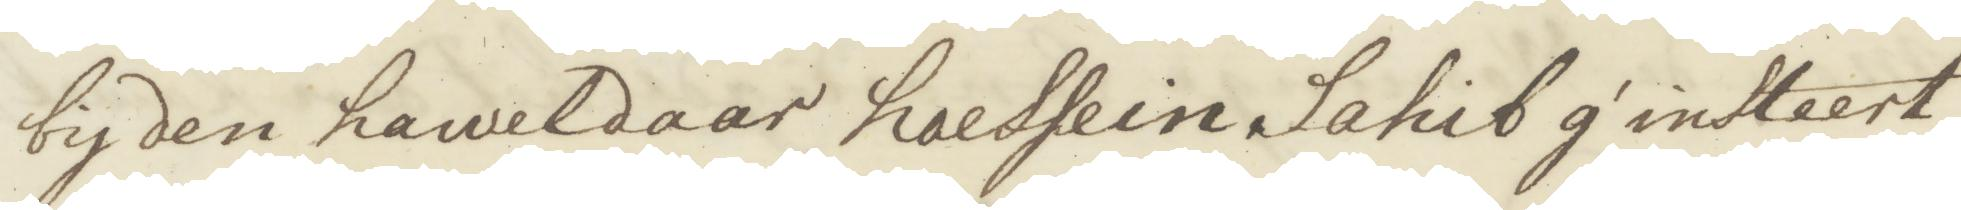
bij den haweldaar hoessein sahib g’insteert
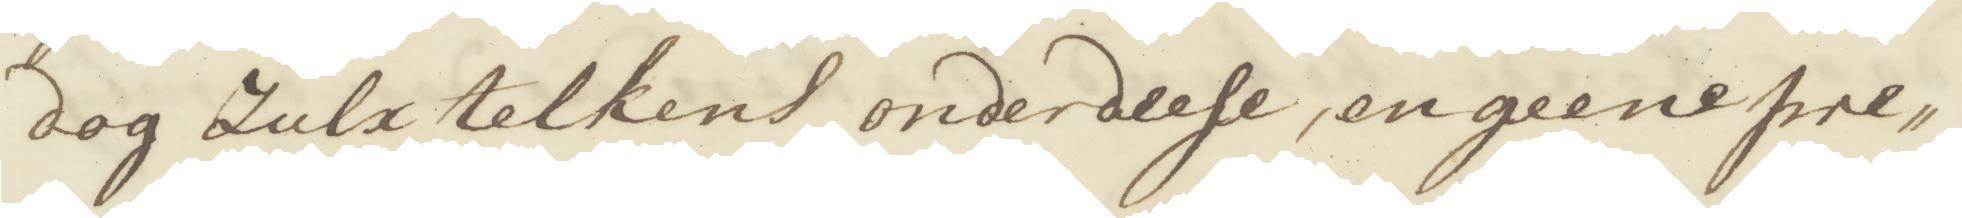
dog zulx telkens onderdeese, en geene pre„
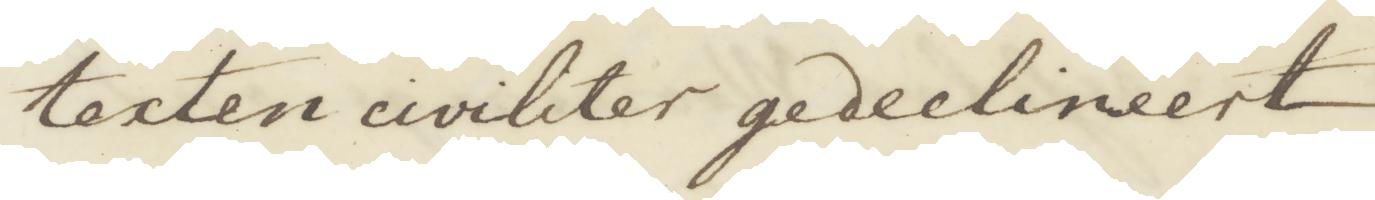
texten civiliter gedeelineert
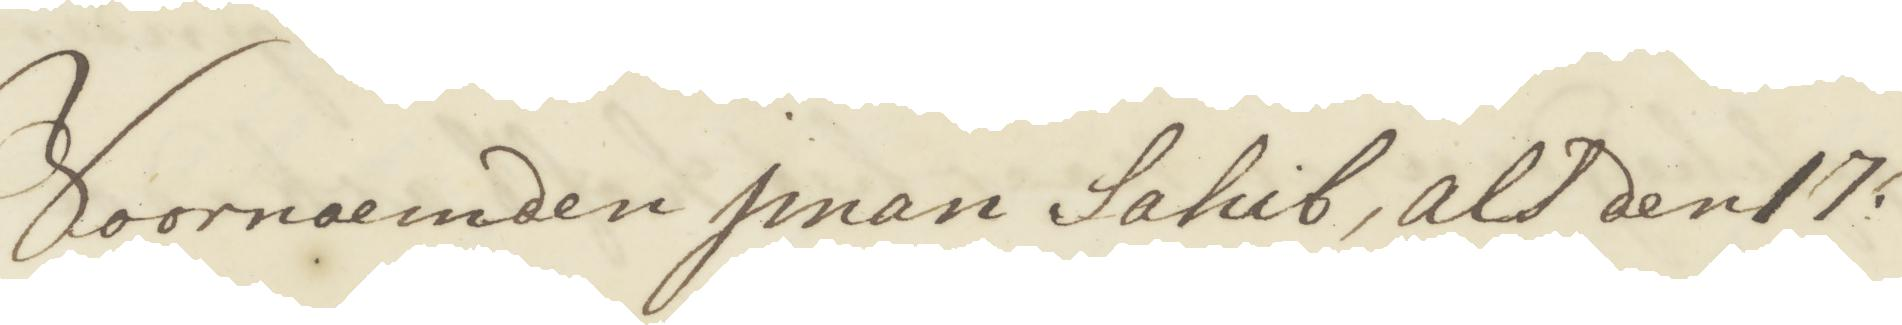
Voornoemden jman sahib, als den 17:'
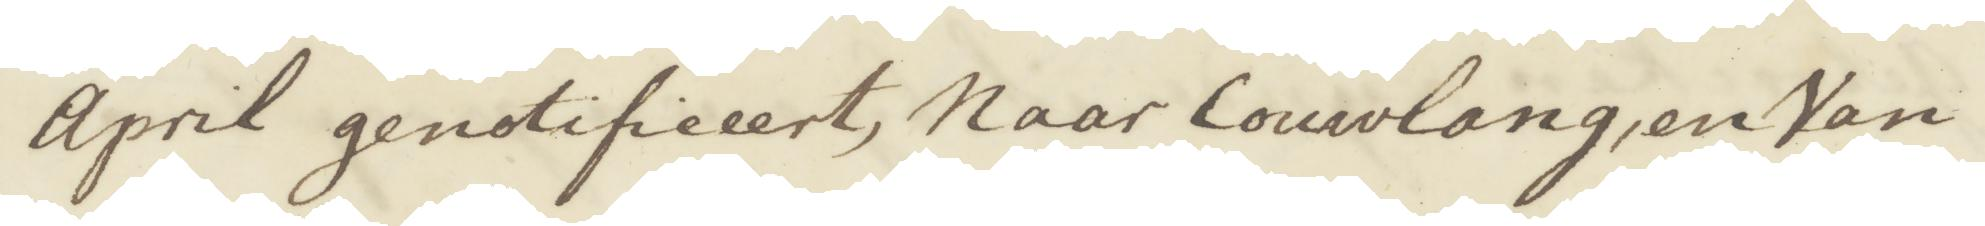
April genotificeert, naar couwlang, en van
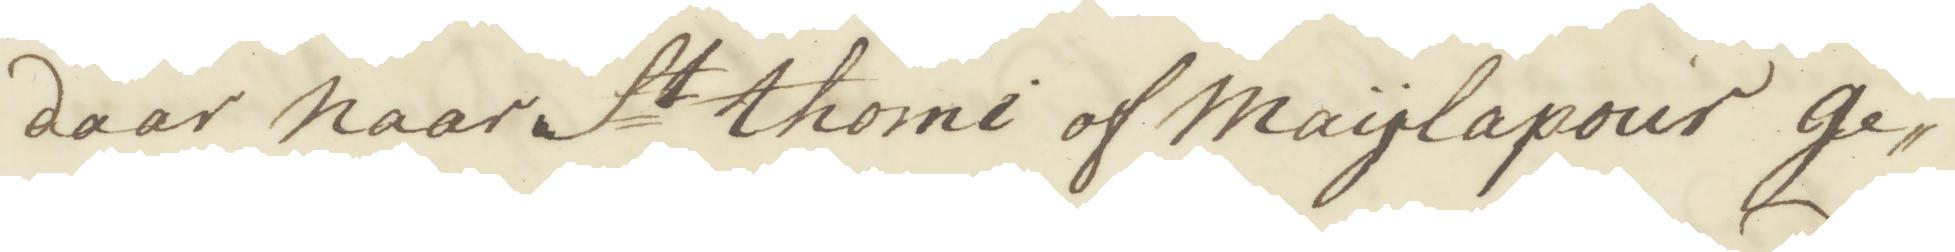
daar naar s=t thomi of maijlapour ge„
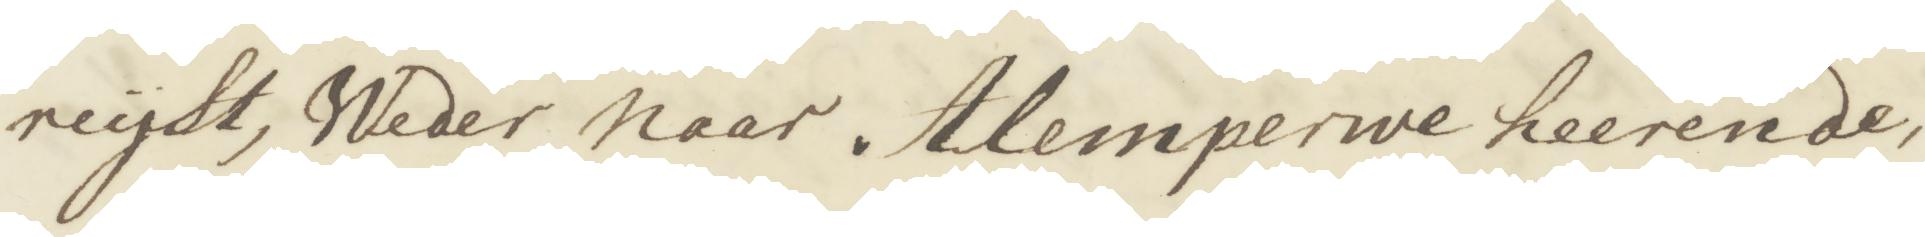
reijst, weder naar Alemperwe keerende,
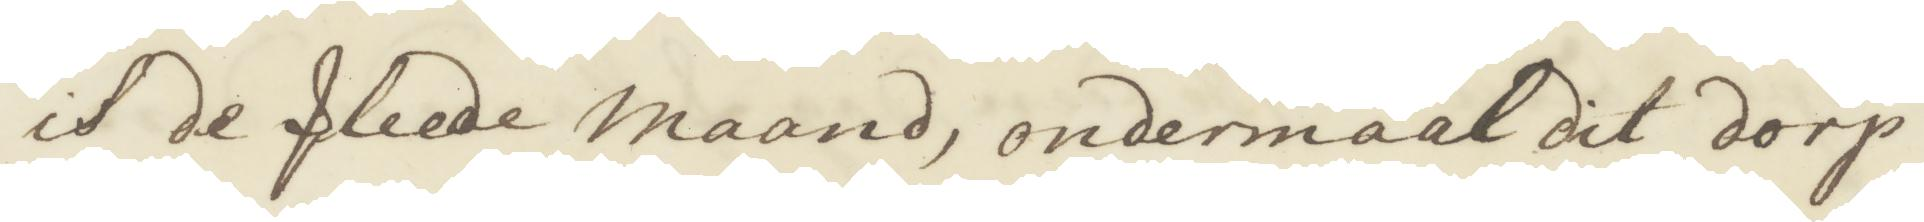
is de verleede maand, ondermaal dit dorp
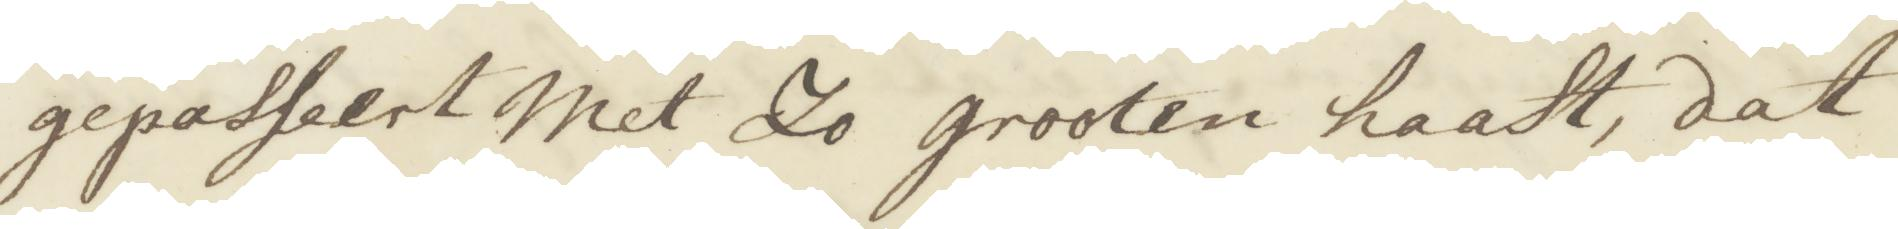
gepasseert met zo grooten haast, dat
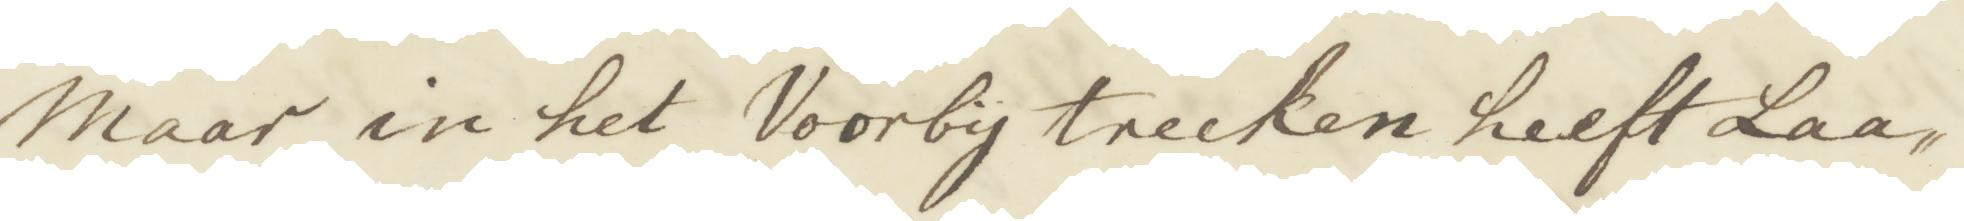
maar in het voorbij trecken heeft Laa„
